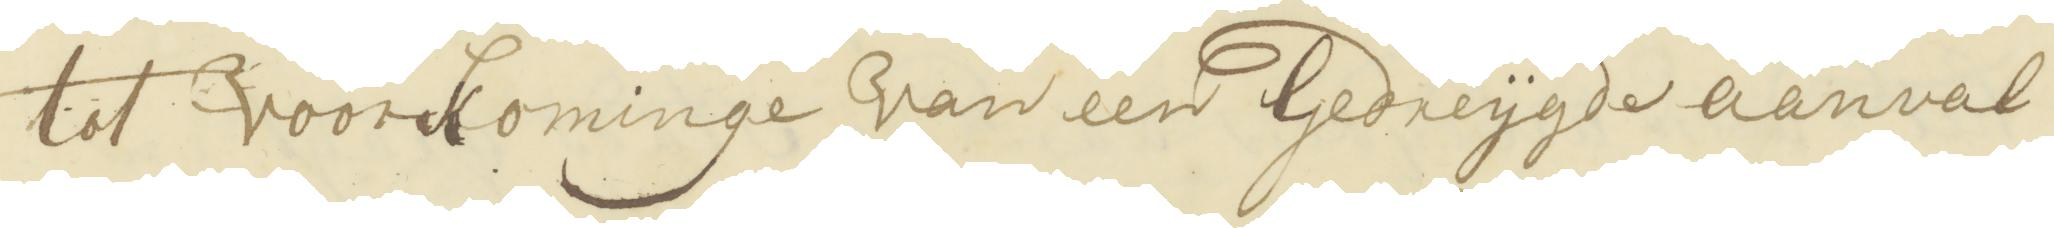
tot voorkominge van een Gedreijgde aanval
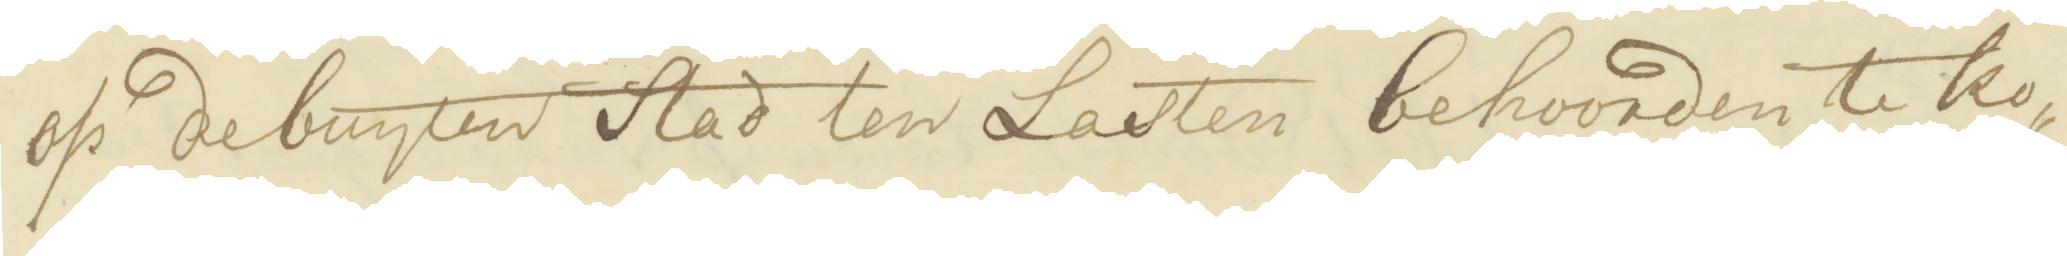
op debuyten stad ten Lasten behoorden te ko„
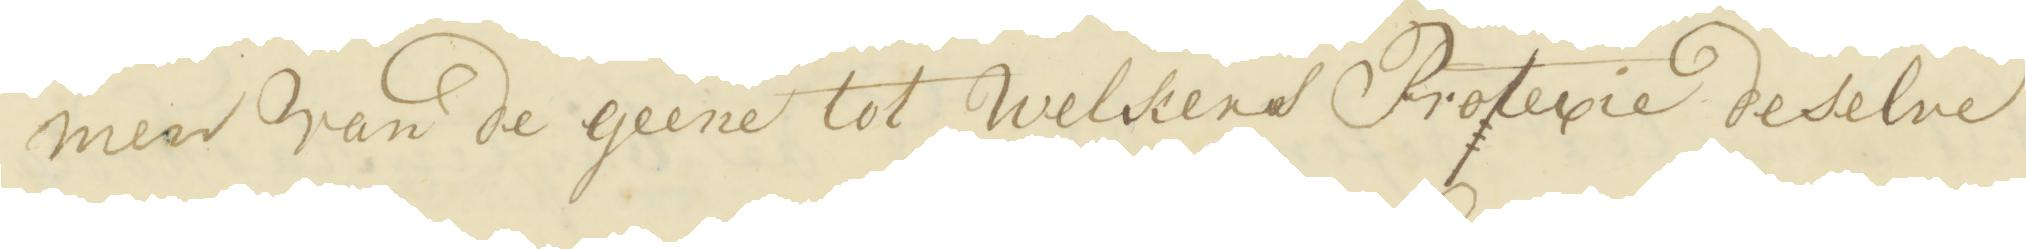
men van de geene tot welkers Protexie deselve
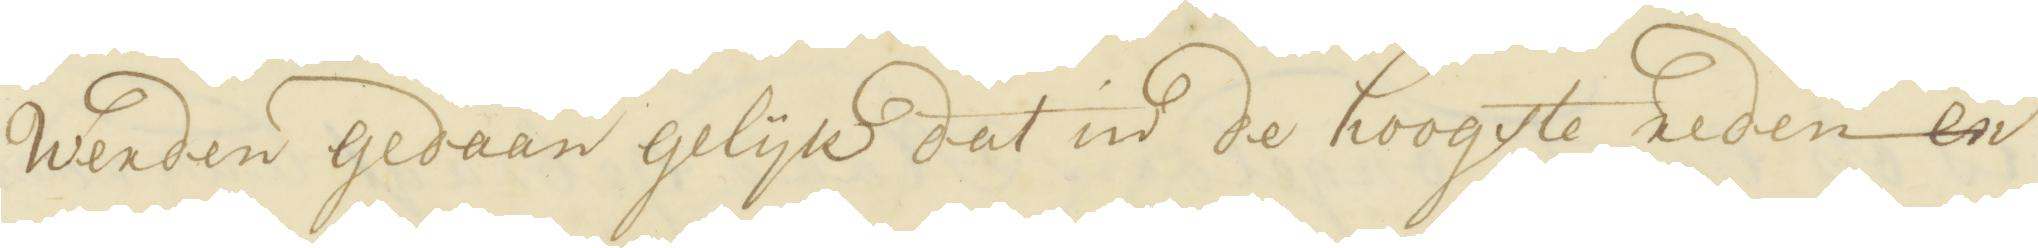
Werden gedaan gelijk dat in de hoogste reden en
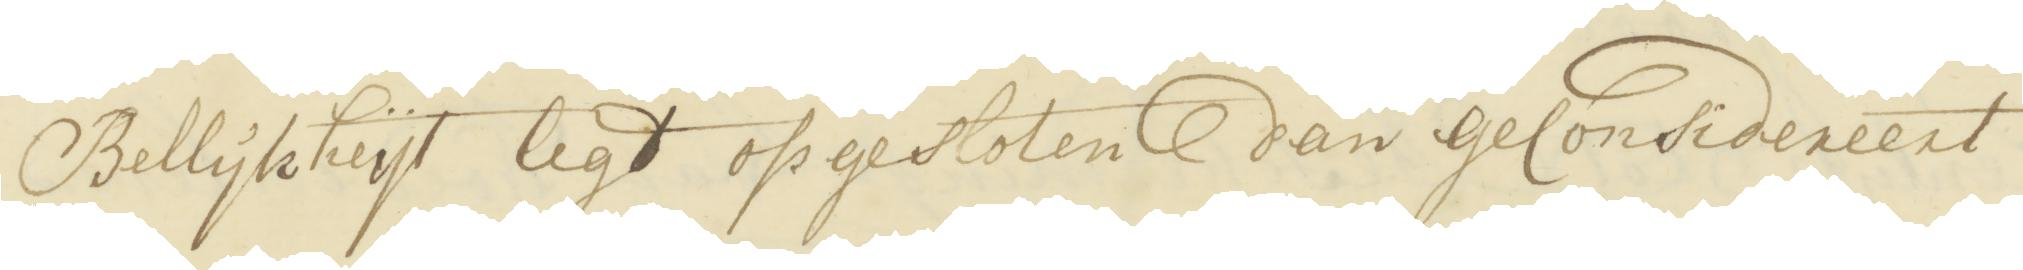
Bellijkheijt legt op gesloten dan geconsidereert
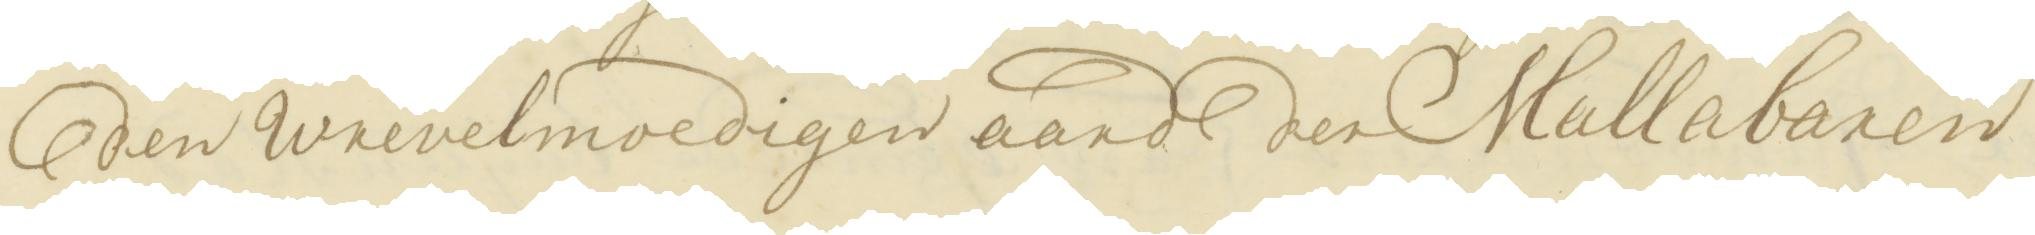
den wrevelmoedigen aard der Mallabaren
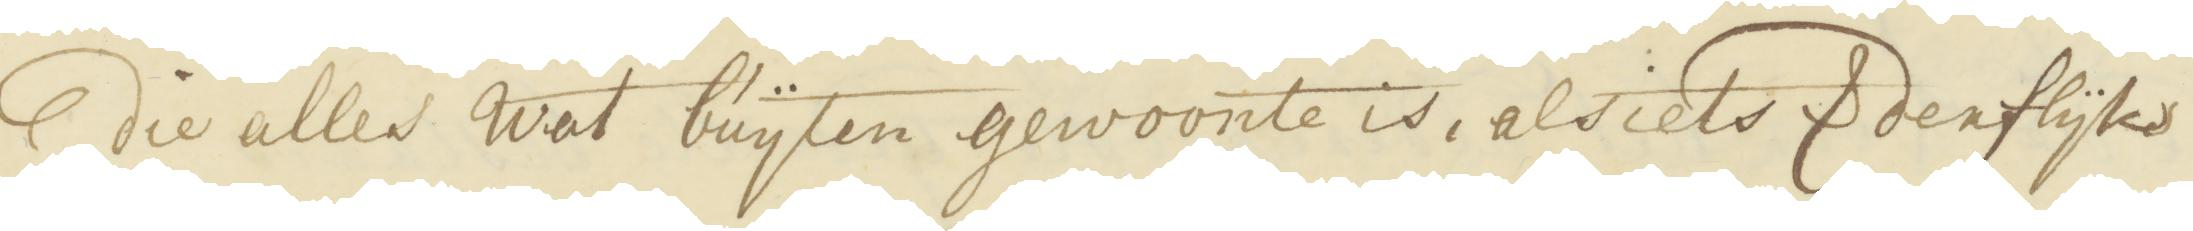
die alles wat buijten gewoonte is, alsiets verderflijks
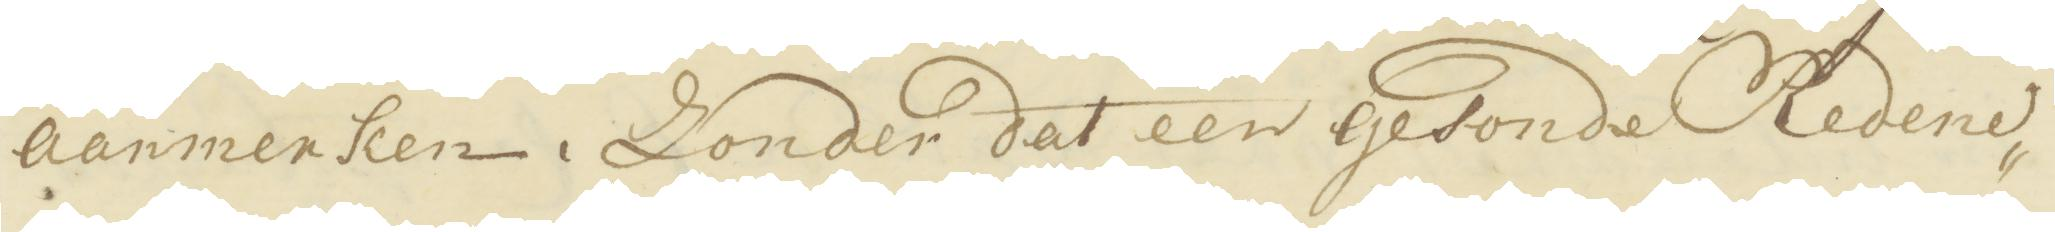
aanmerken, zonder dat een gesonde Redene„
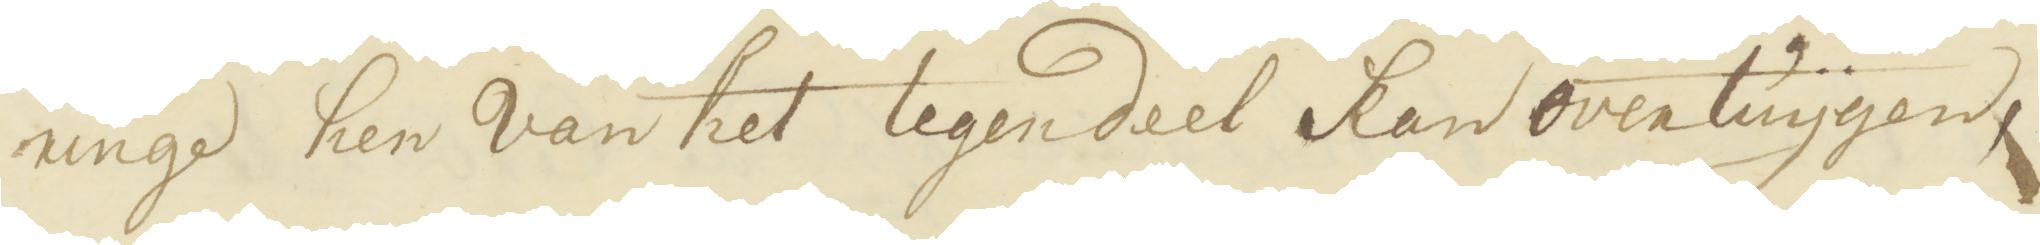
ringe hen van het tegendeel kan overtuijgen,
